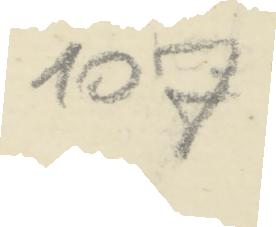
107.
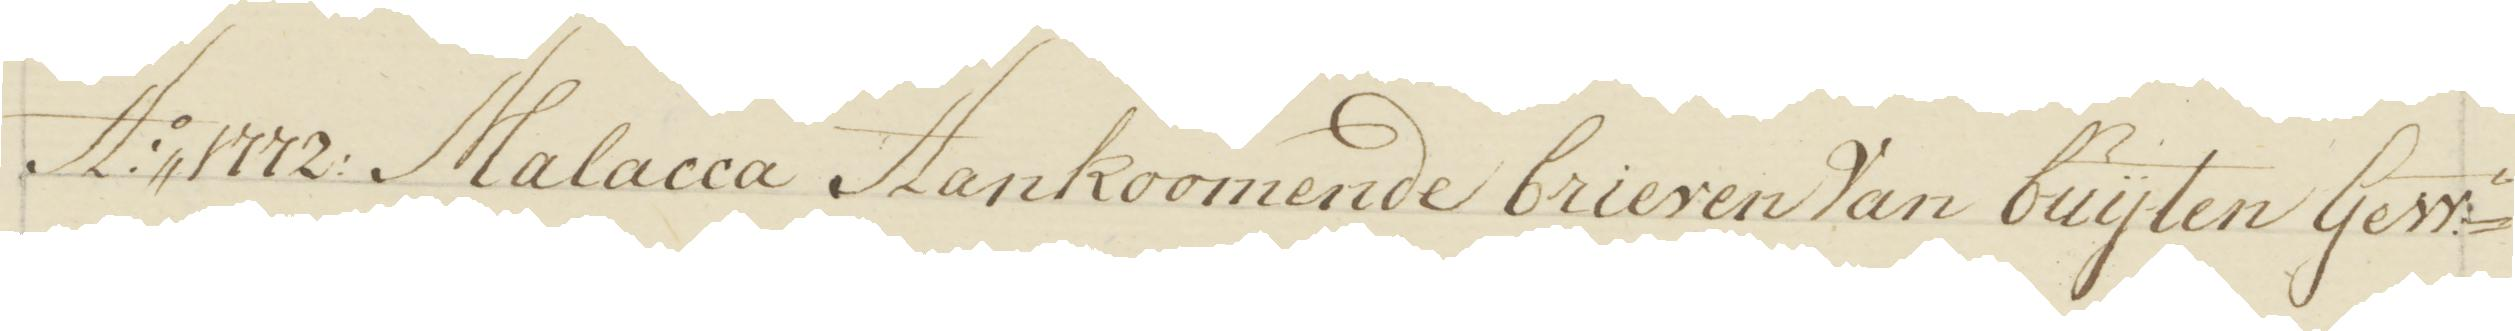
A„o 1772: Malacca Aankoomende brieven van buijten Gew=en
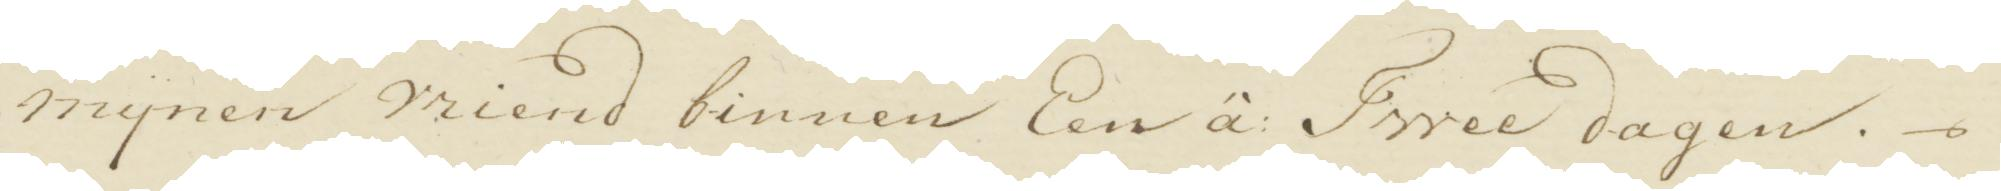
mijnen vriend binnen Een â: Twee dagen.—
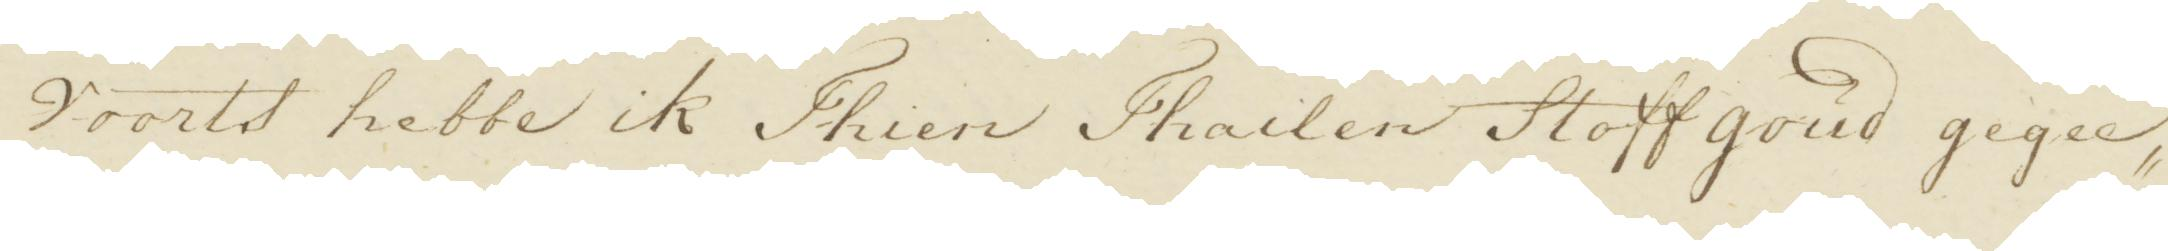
voorts hebbe ik Thien Thailen Stoff goud gegee„
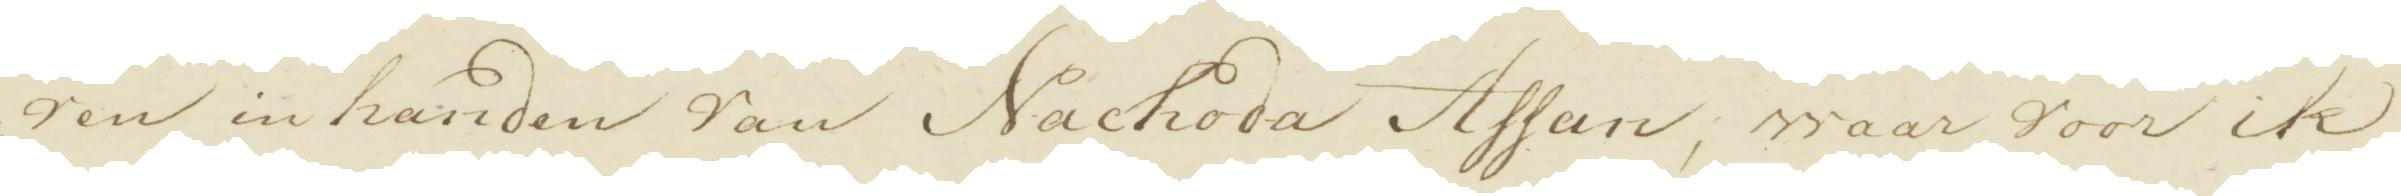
„ven in handen van Nachoda Assan; waar voor ik
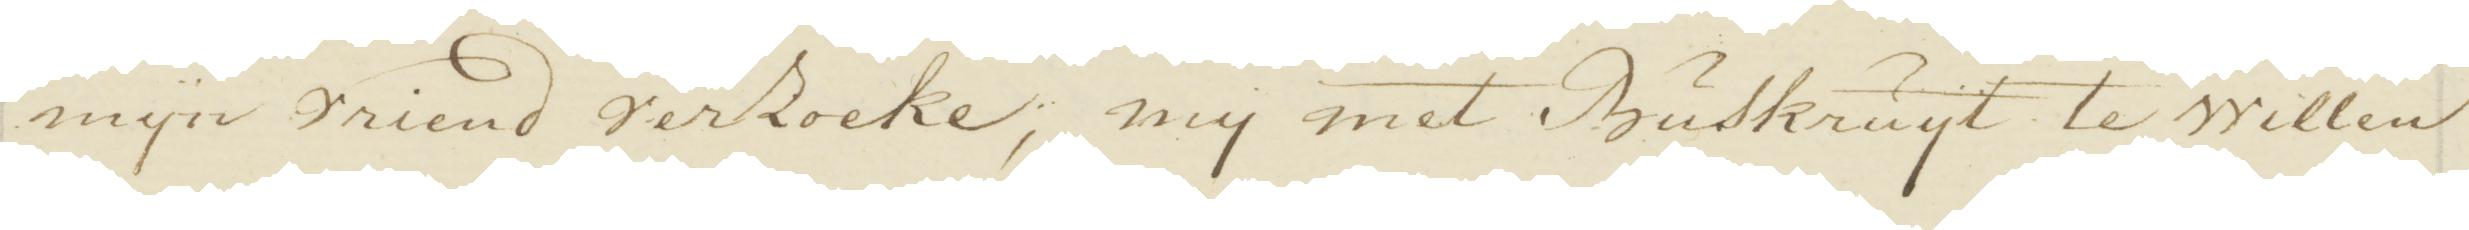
mijn vriend verzoeke; mij met Buskruijt te willen
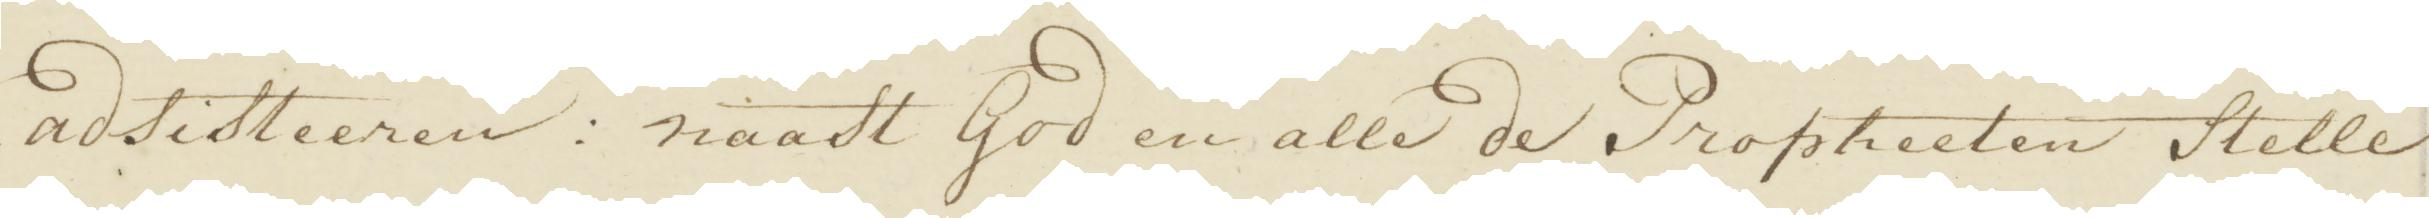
adsisteeren: naast God en alle de Propheeten Stelle
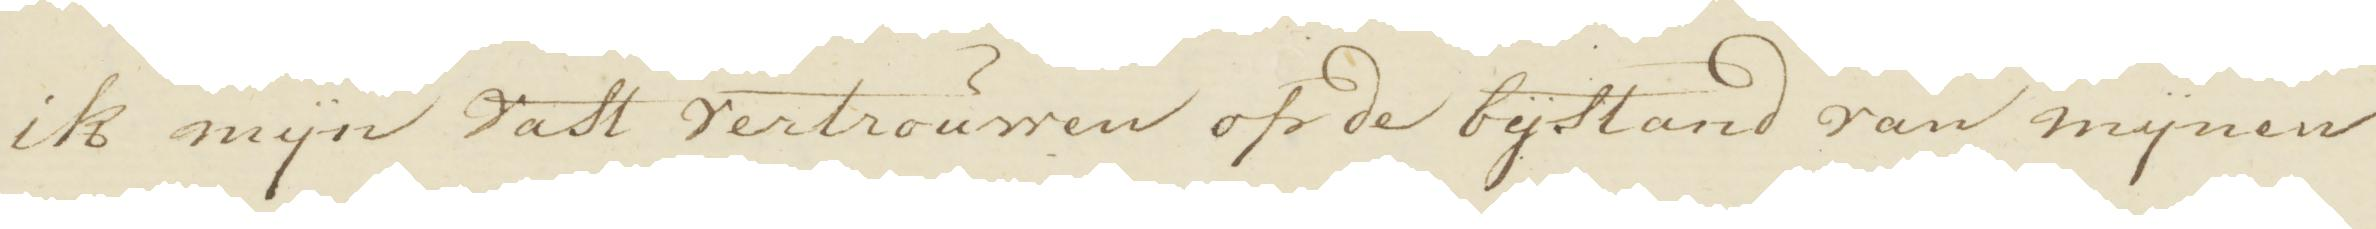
ik mijn vast vertrouwen op de bijstand van mijnen
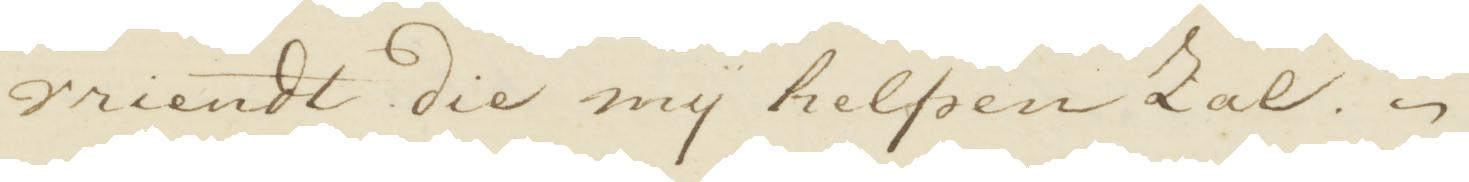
vriendt die mij helpen Zal.~
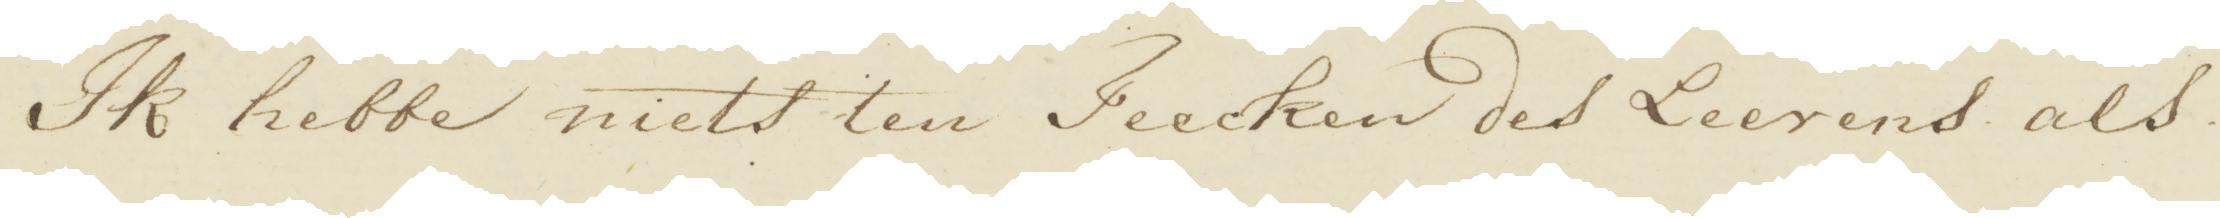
Ik hebbe niets ten Teecken des Leevens als
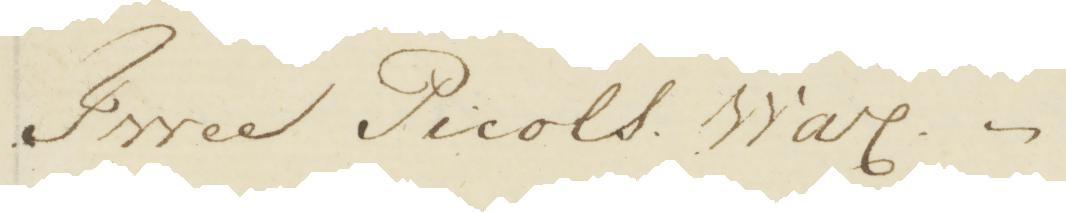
Twee Picols. Wax.~
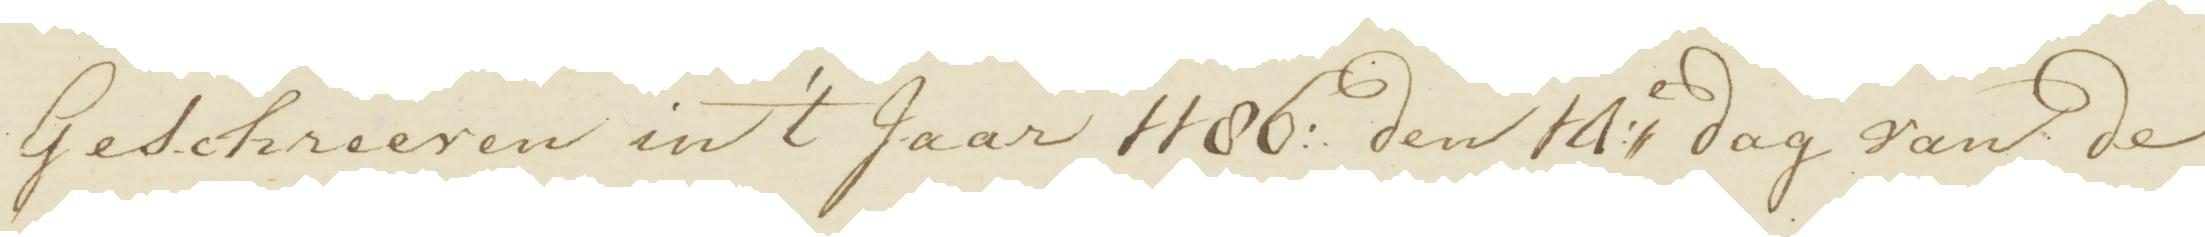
Geschreeven in ’t Jaar 1186: den 14:„e dag van de
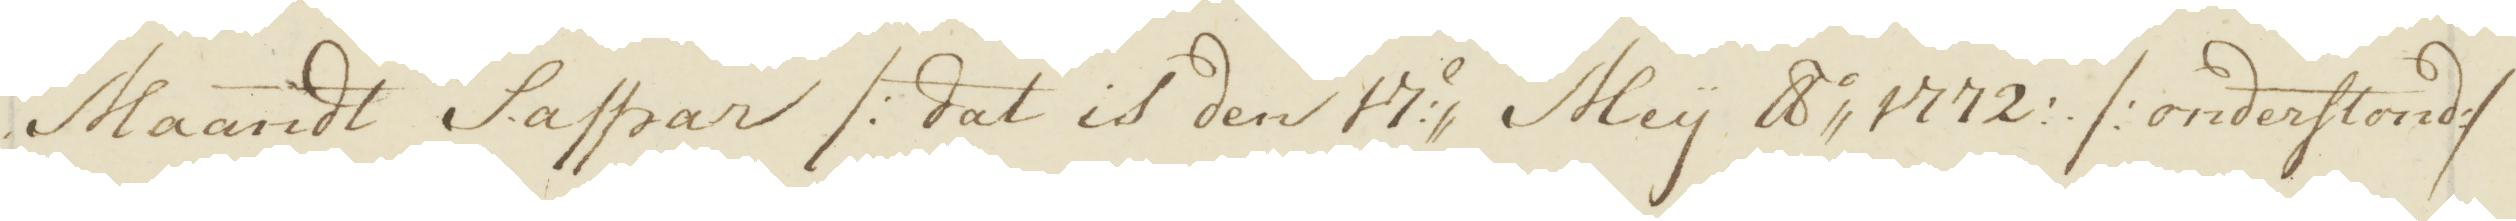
Maandt Sappar /: dat is den 17:„e Meij 18„o 1772: ./: onderstond:/
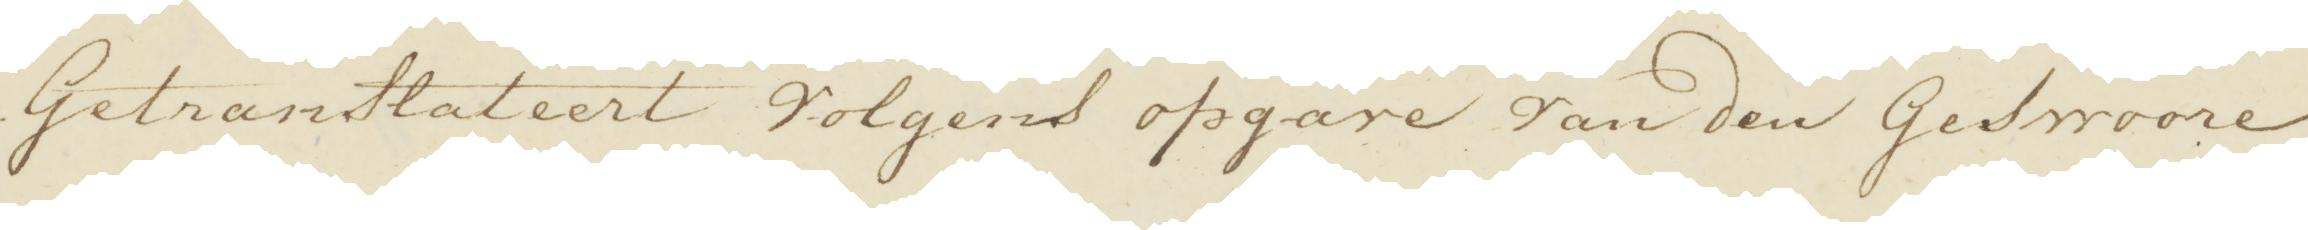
Getranslateert volgens opgave van den Geswoore
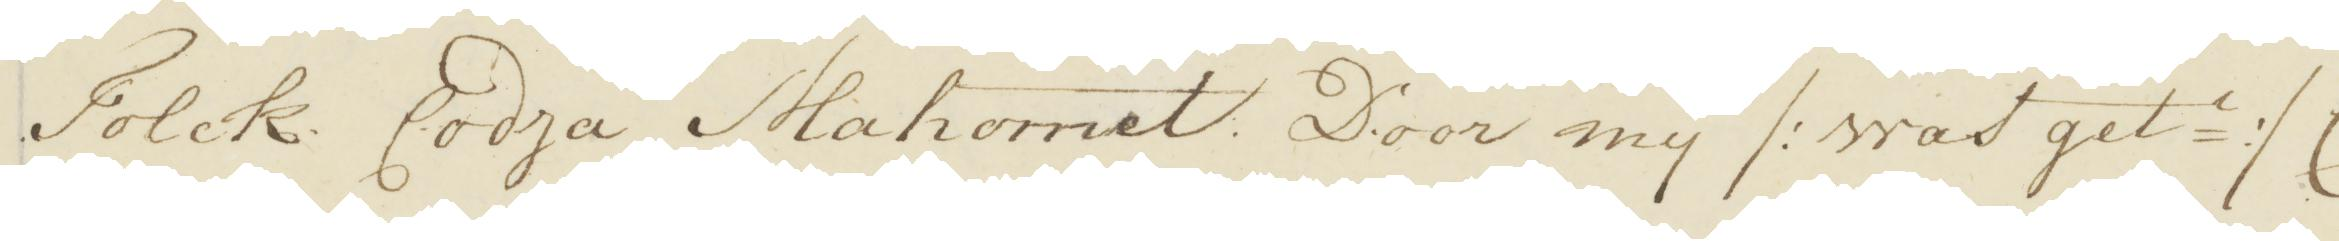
Tolck: Codja Mahomet. Door mij /: was get=t :/ C
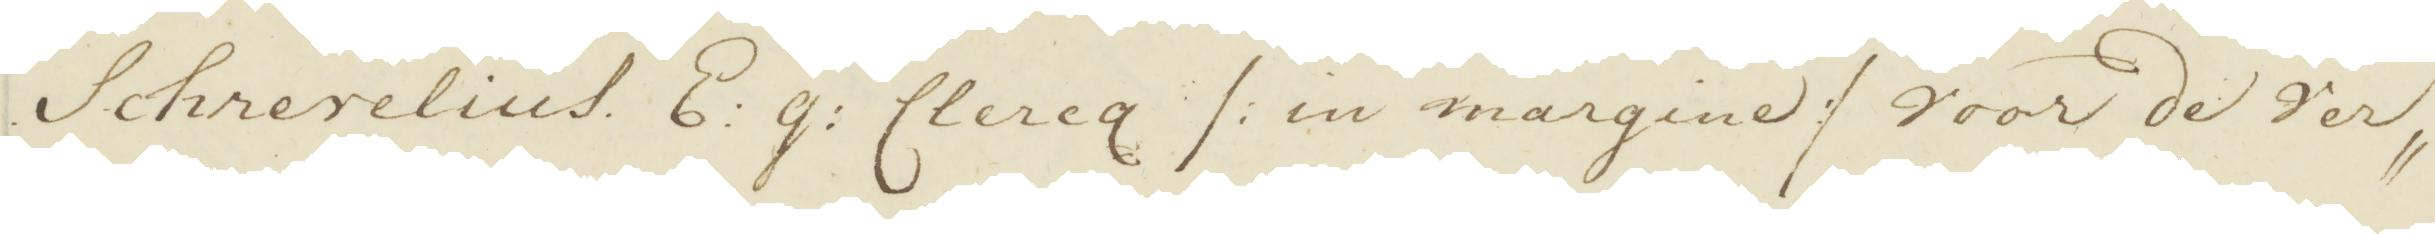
Schrevelius. E: g: Clercq /: in margine :/ voor de ver„
